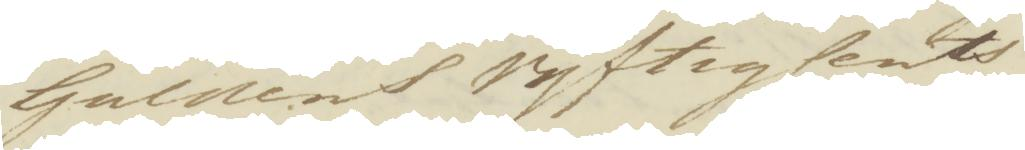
Guldens vijftig Cents
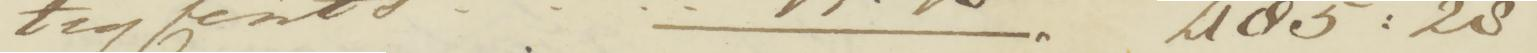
tig Cents . . 17: 78 485 : 28
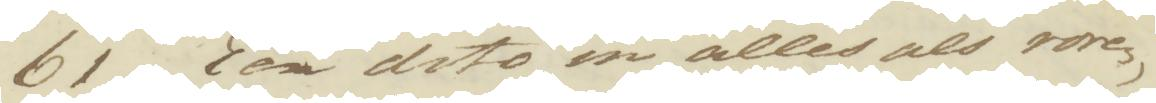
61 Een dito in alles als voren,
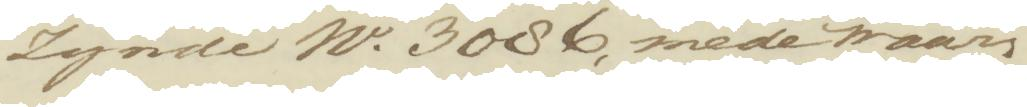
Zynde n.o 3086, mede waar
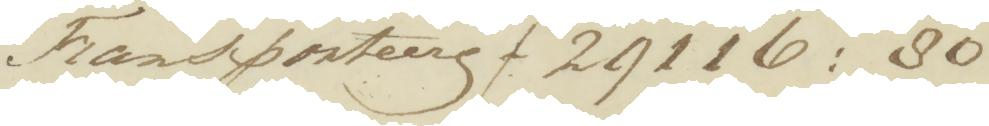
Transporteere ƒ 29116 : 80
